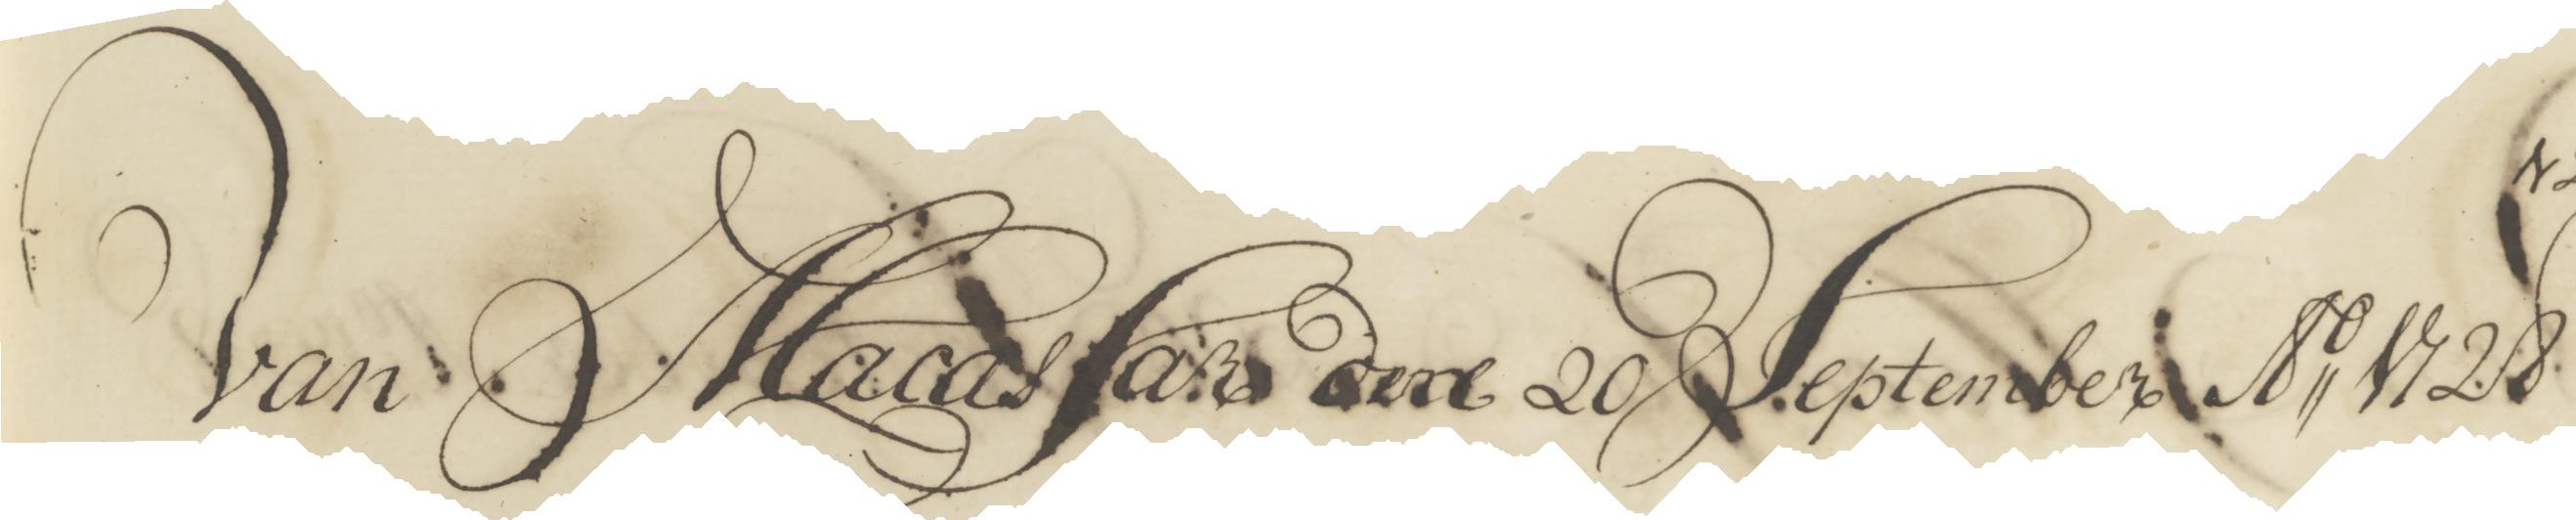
Van Macassar den 20 September A„o 1728
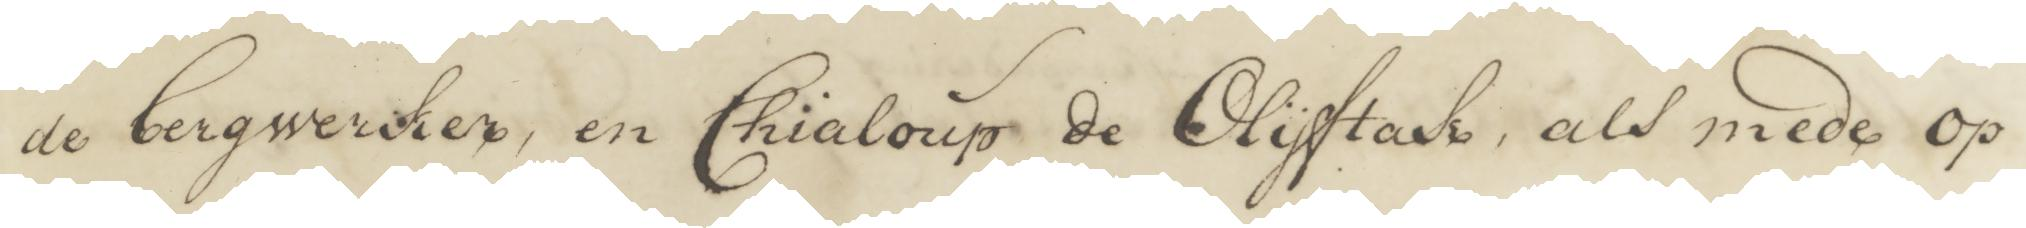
de bergwerker, en Chialoup de Olijftak, als mede op
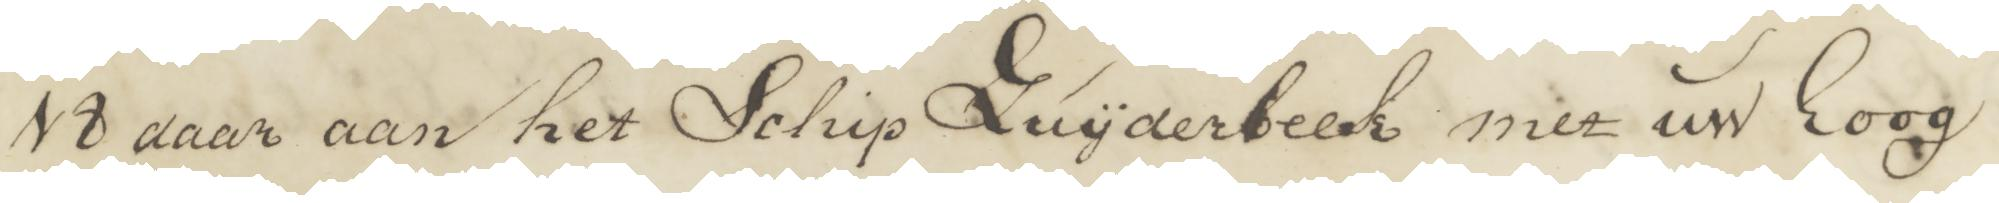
18 daar aan het schip zuijderbeek met uw hoog
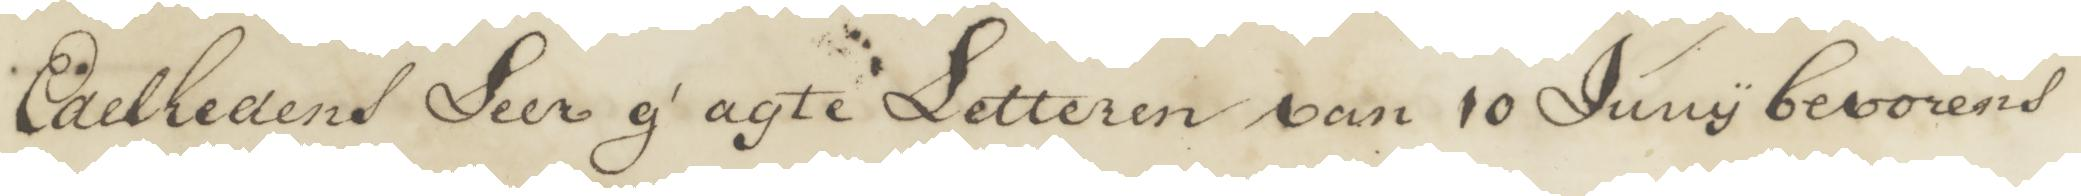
Edelhedens seer g’agte Letteren van 10 Iunij bevorens
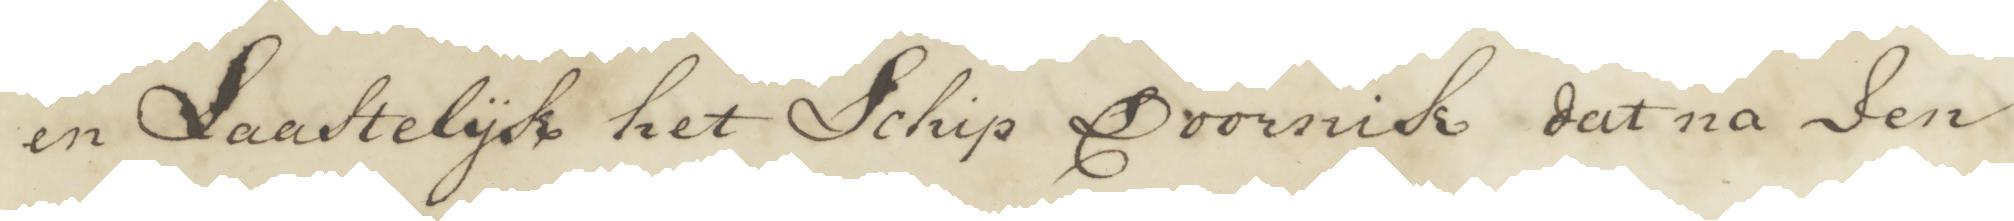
en Laastelijk het schip Doornik dat na Een
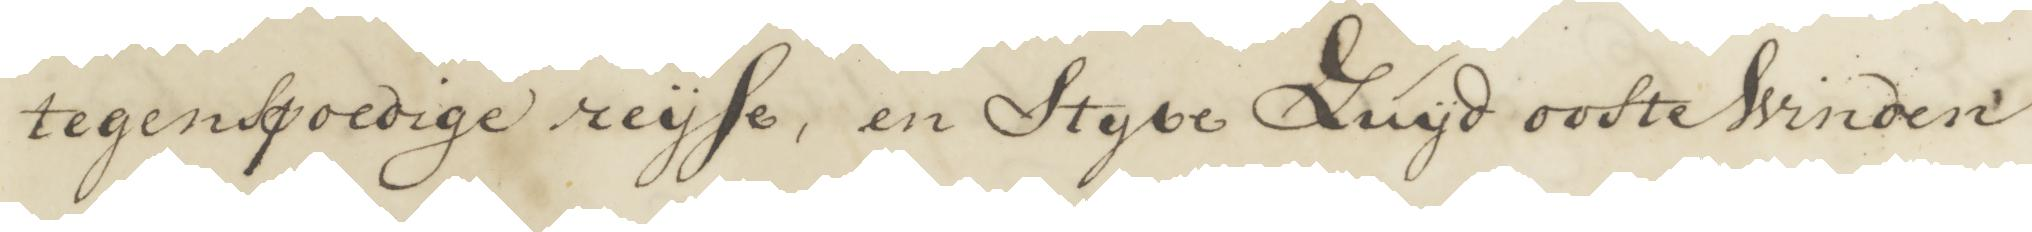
tegenspoedige reijse, en styve zuijd ooste winden
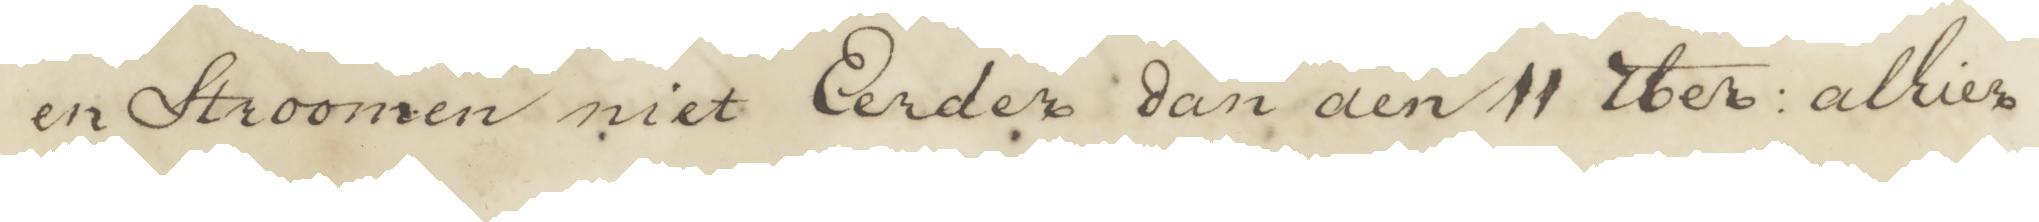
en stroomen niet Eerder dan den 11 7ber: alhier
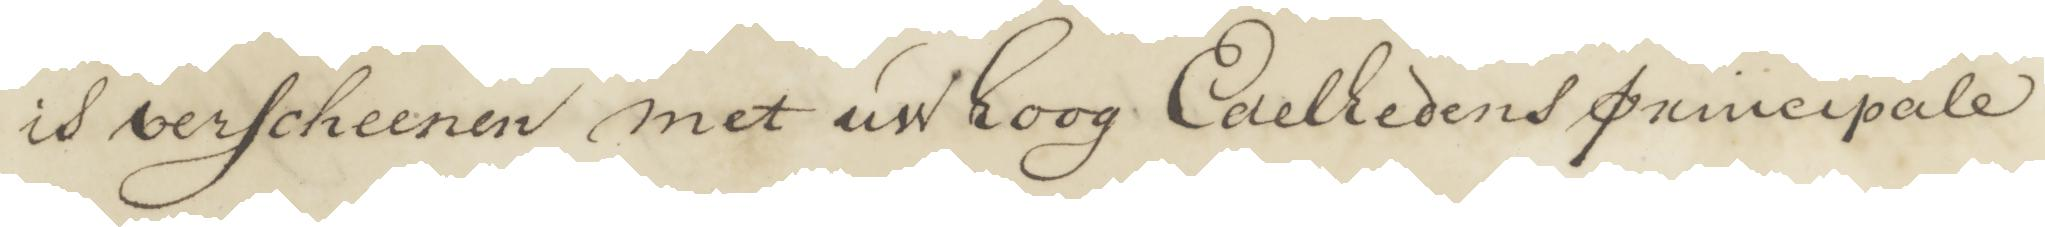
is verscheenen met uw hoog Edelhedens principale
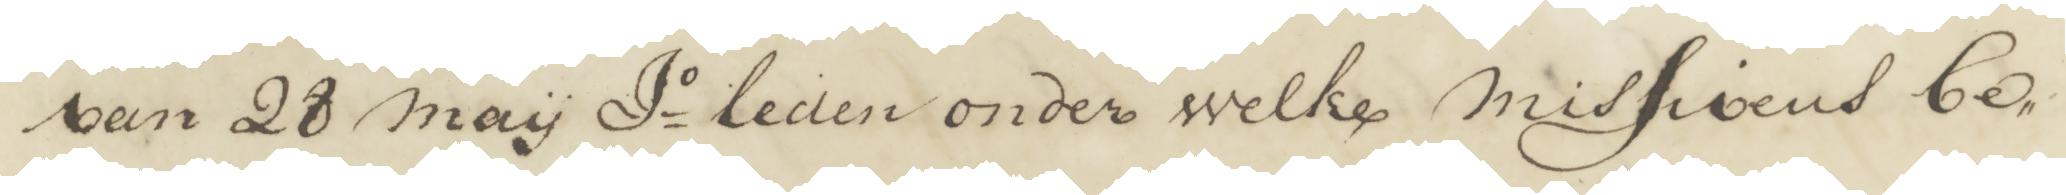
van 28 maij J=o leden onder welke missivens be„
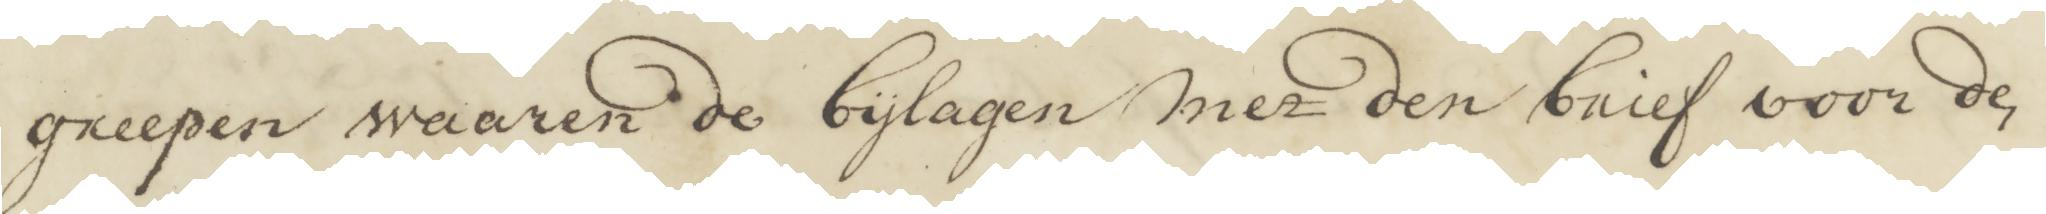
greepen waaren de bijlagen met den brief voor den
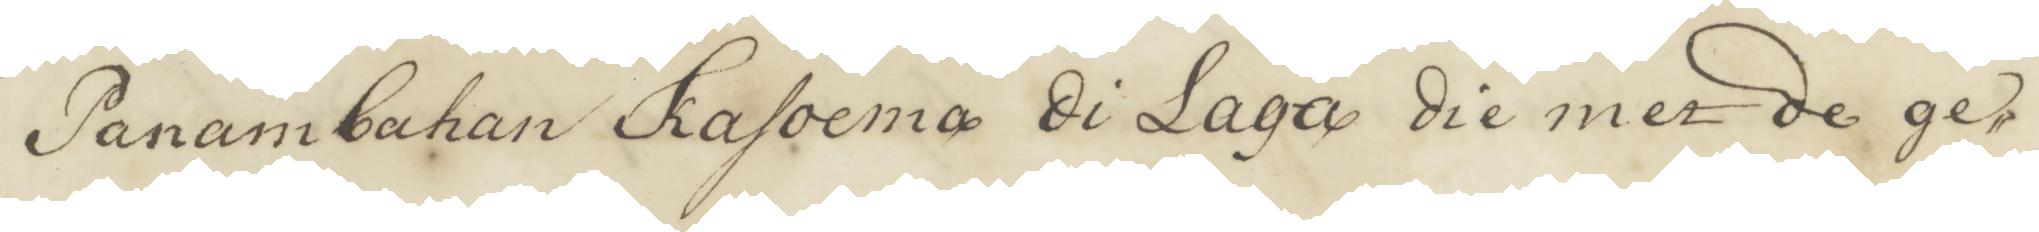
Panambahan Kasoema di Laga die met de ge„
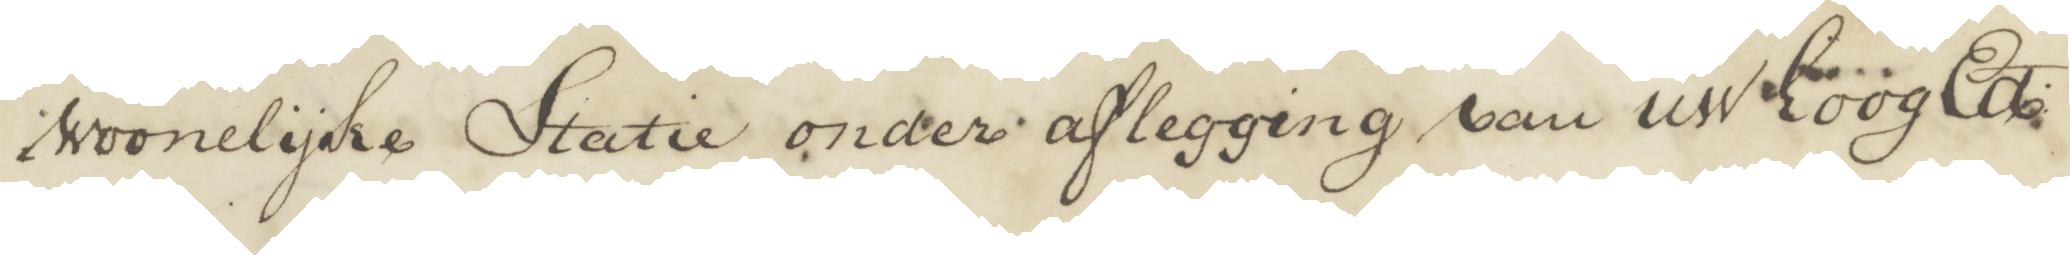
woonelijke statie onder aflegging van uw hoog Ed:
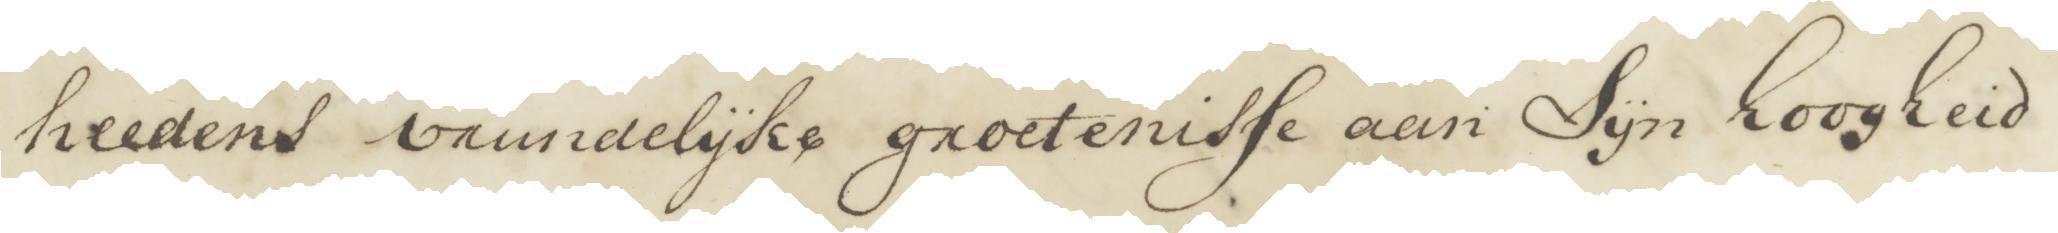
heedens vrundelijke groetenisse aan sijn hoogheid
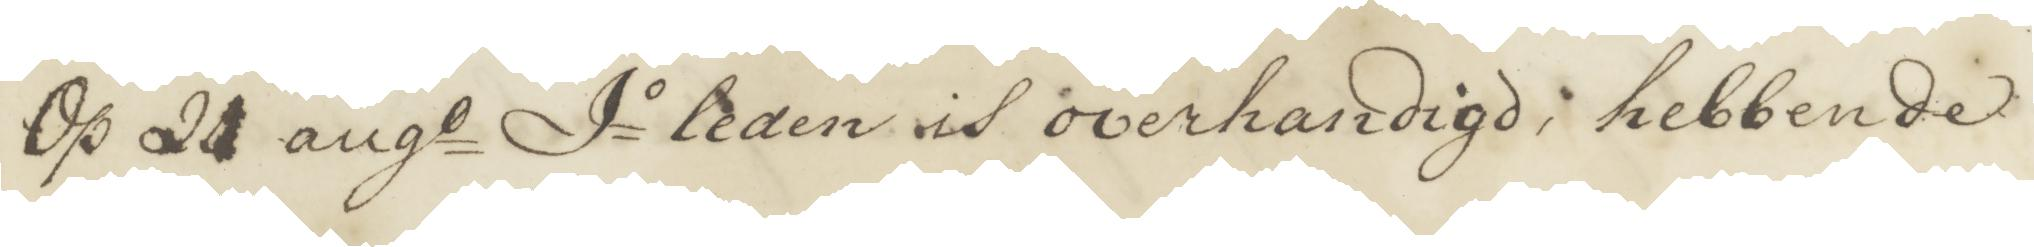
Op 24 aug=o I=o leden is overhandigd; hebbende
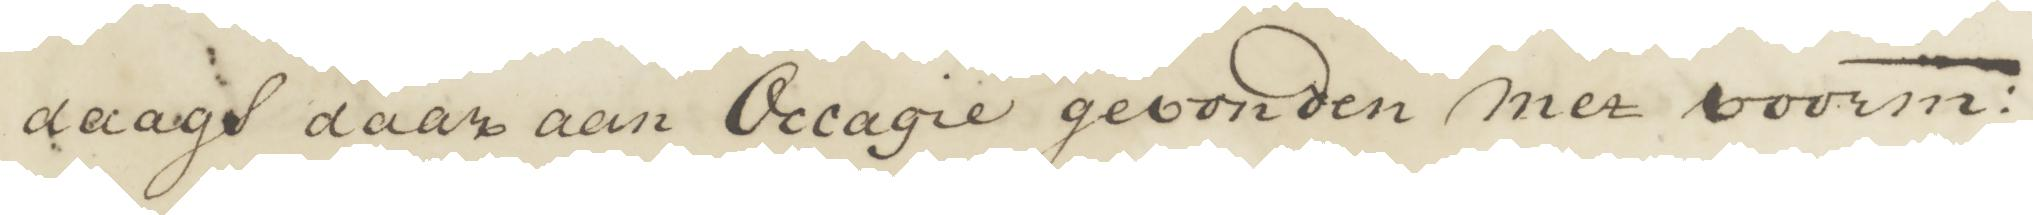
daags daar aan Occagie gevonden met voorm:
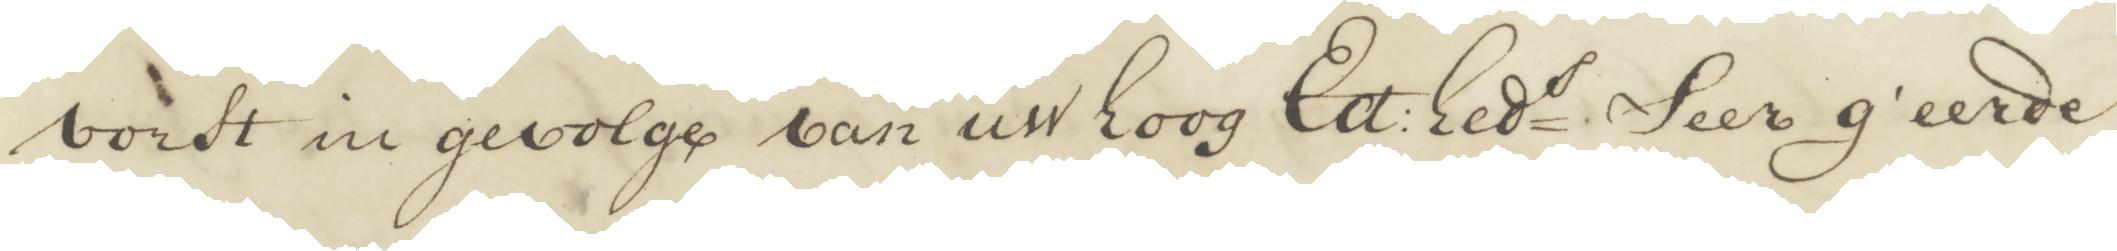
vorst in gevolge van uw hoog Ed: hed=s seer g’eerde
